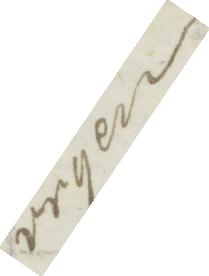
vrijen
